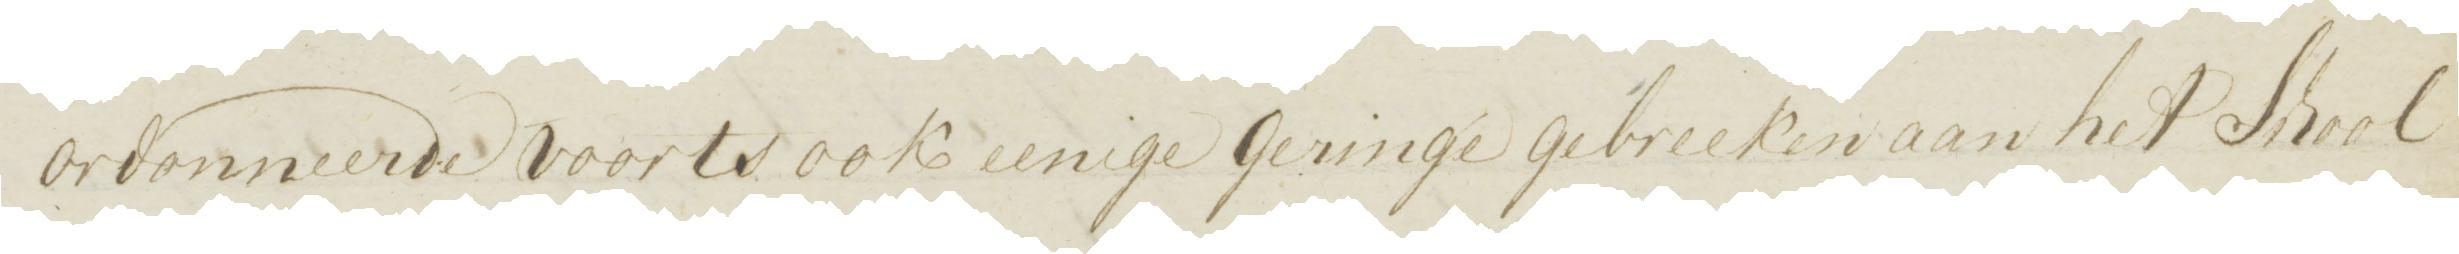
ordonneerde voorts ook eenige geringe gebreeken aan het school
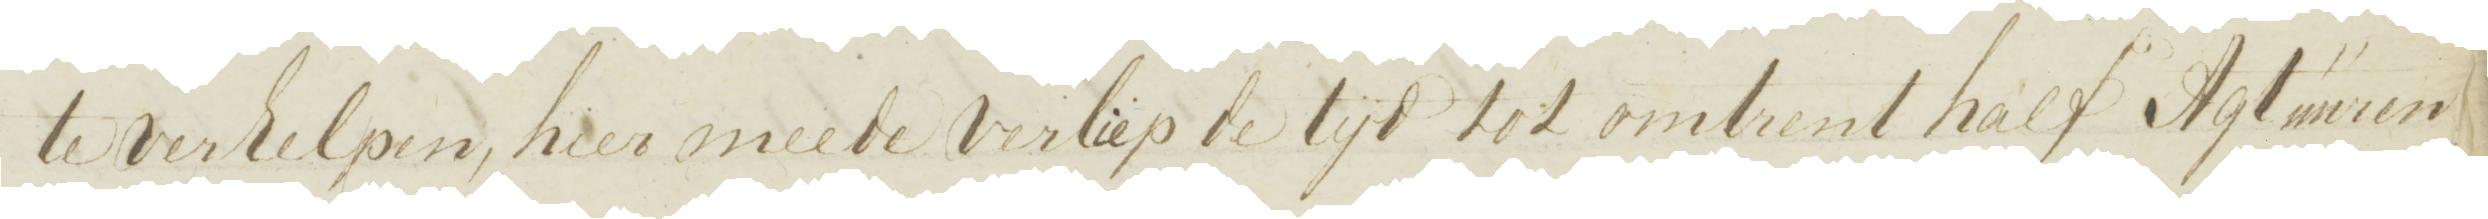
te verhelpen, hier meede verliep de tijd tot omtrent half Agt uuren
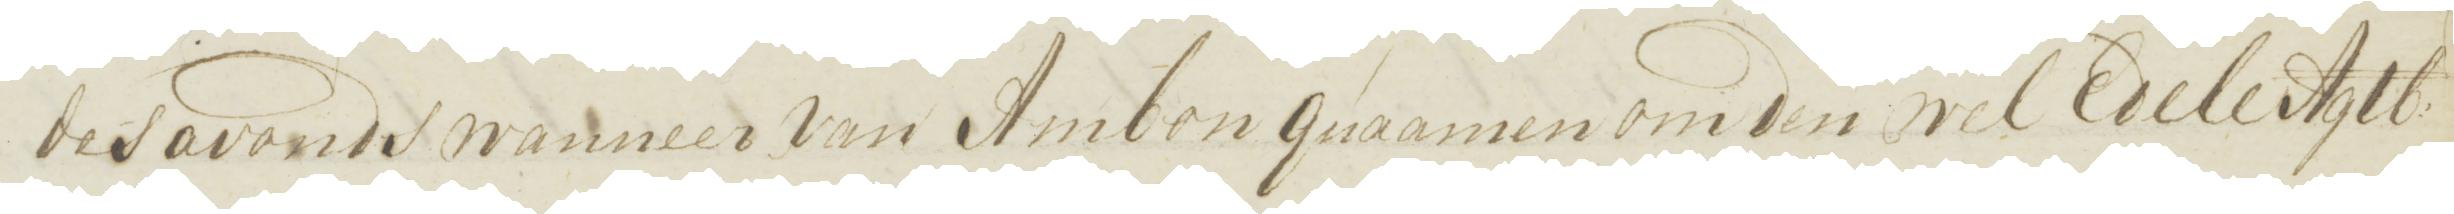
des avonds wanneer van Ambon quaamen om den wel Edele Agtb:
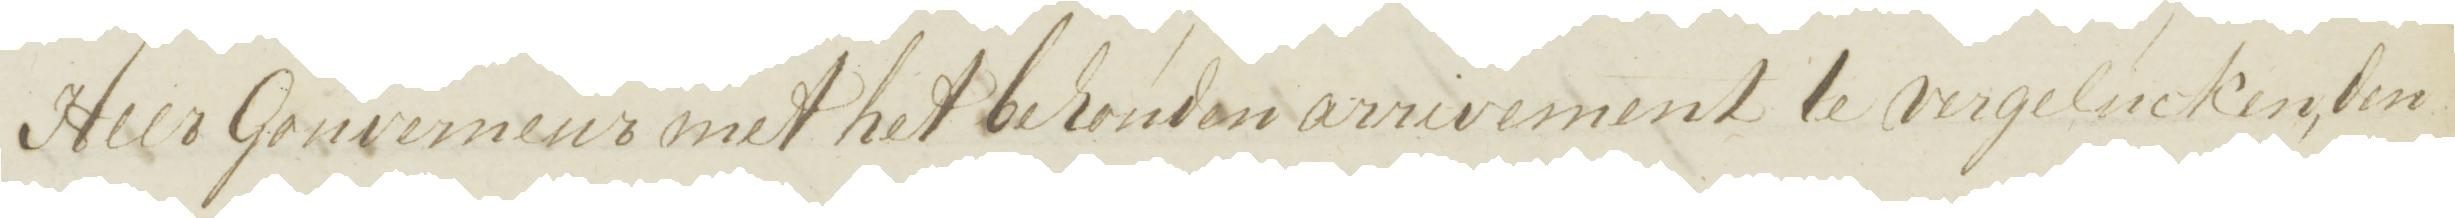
Heer Gouverneur met het behouden arrivement te vergelucken, den
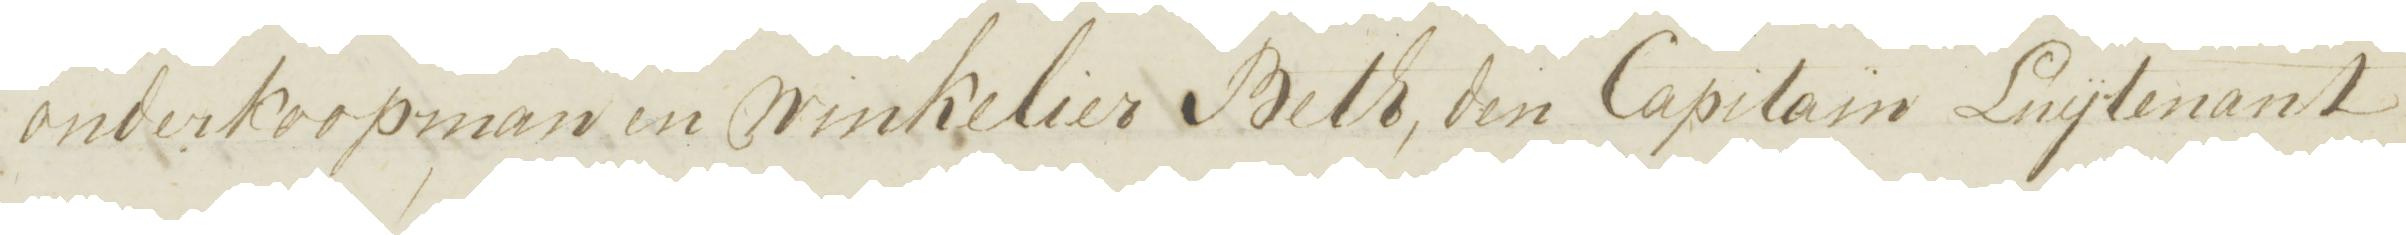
onderkoopman en winkelier Beth, den Capitain Luijtenant
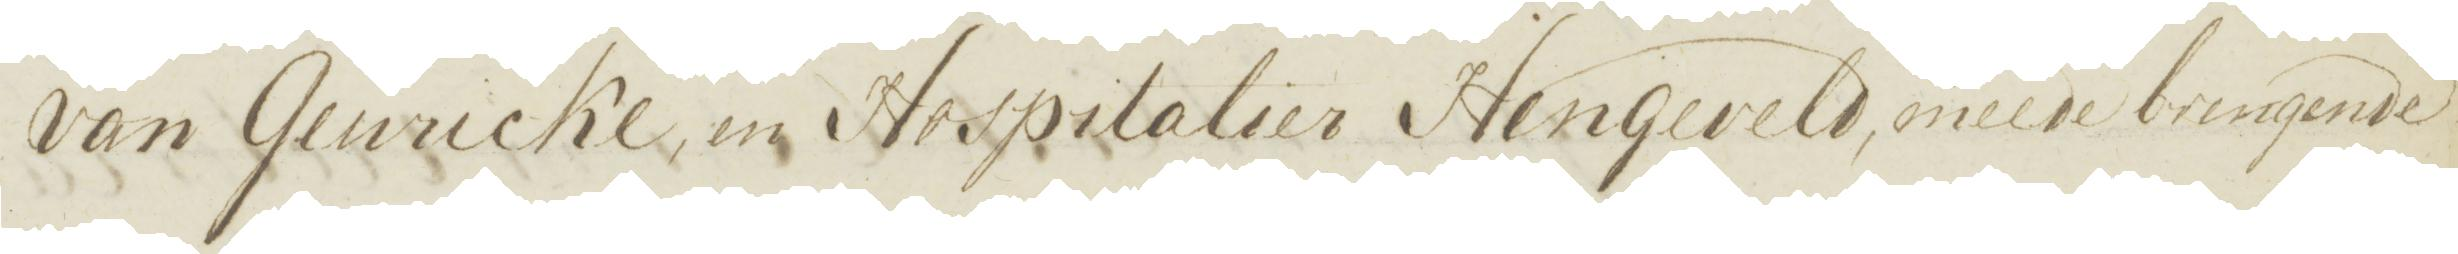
van Geuricke, en Hospitalier Hengeveld, meede brengende
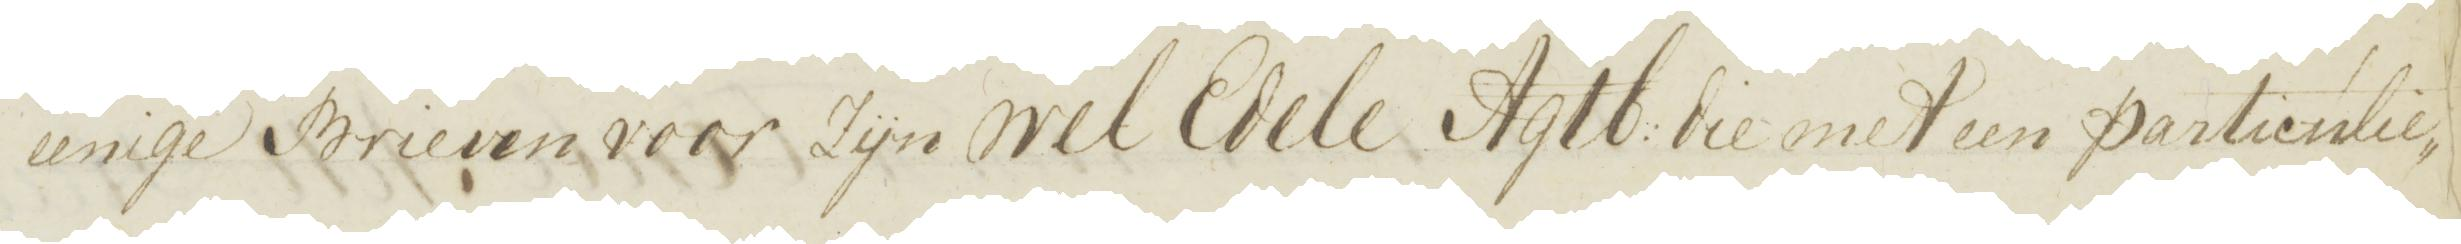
eenige Brieven voor zijn wel Edele Agtb: die met een particulie„
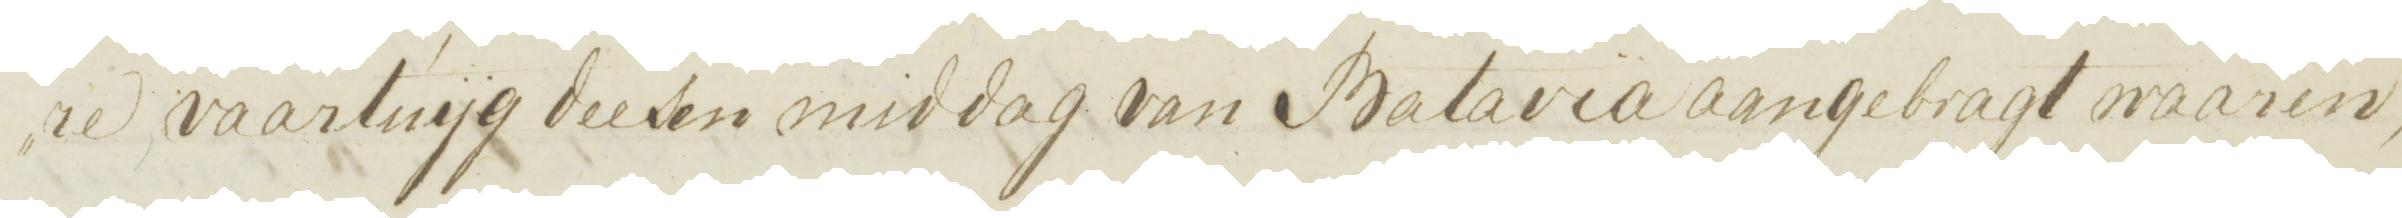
„re vaartuijg deesen middag van Batavia aangebragt waaren
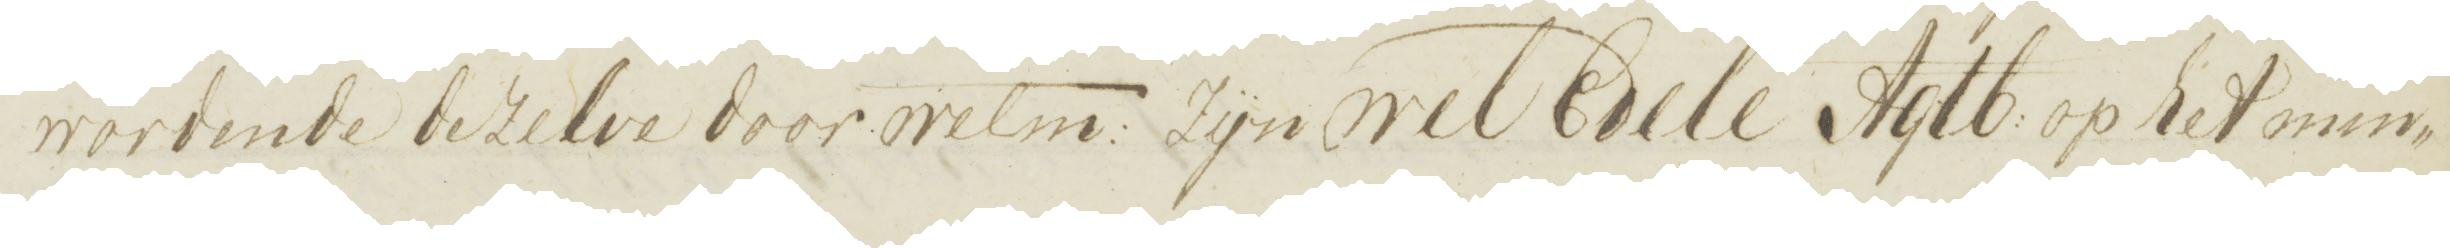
wordende dezelve door welm: zijn wel Edele Agtb: op het min„
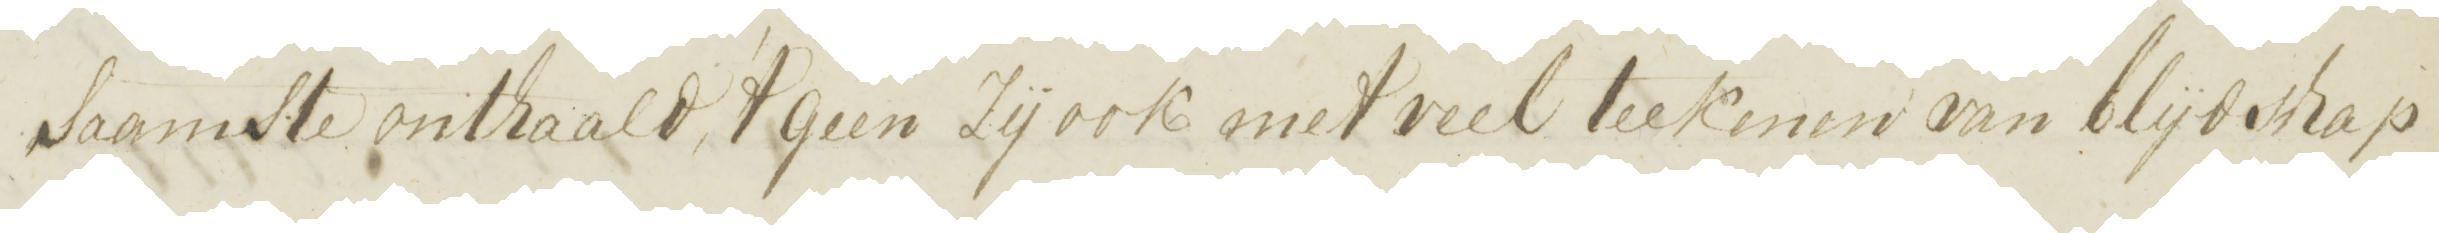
saamste onthaald, 't geen zij ook met veel teekenen van blijdschap
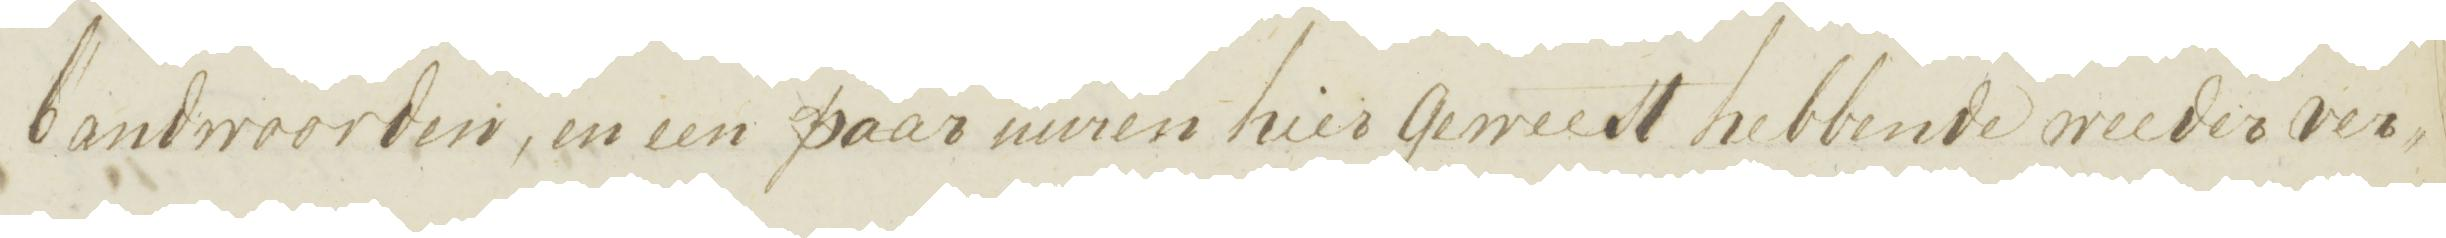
b'andwoorden, en een paar uuren hier geweest hebbende weeder ver„
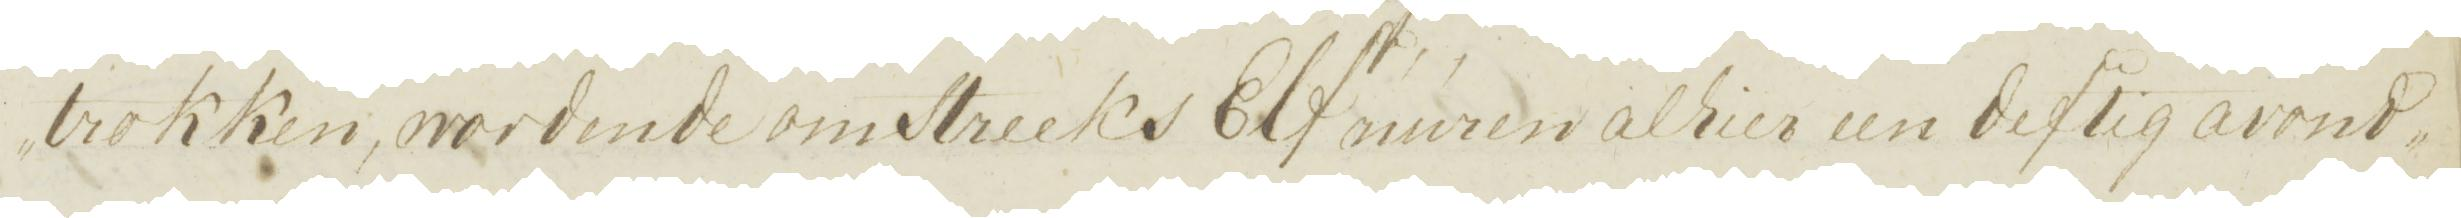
„trokken, wordende omstreeks Elf uuren alhier een deftig avond„
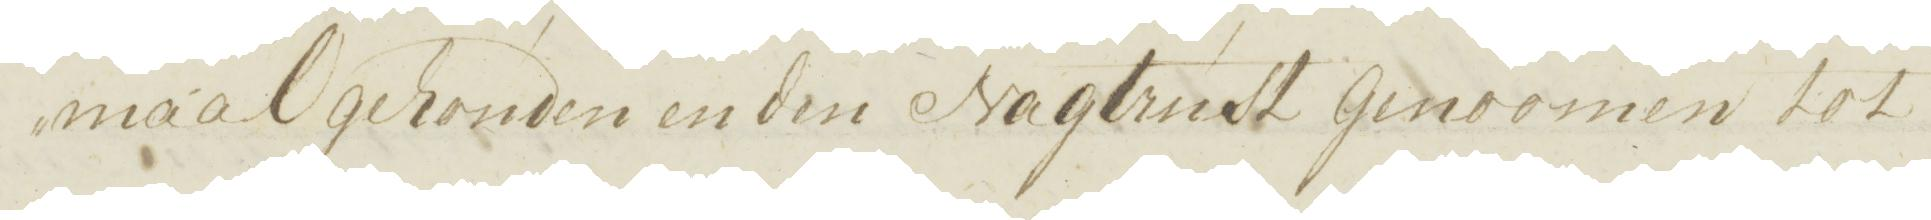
„maal gehouden en den Nagtrust genoomen tot
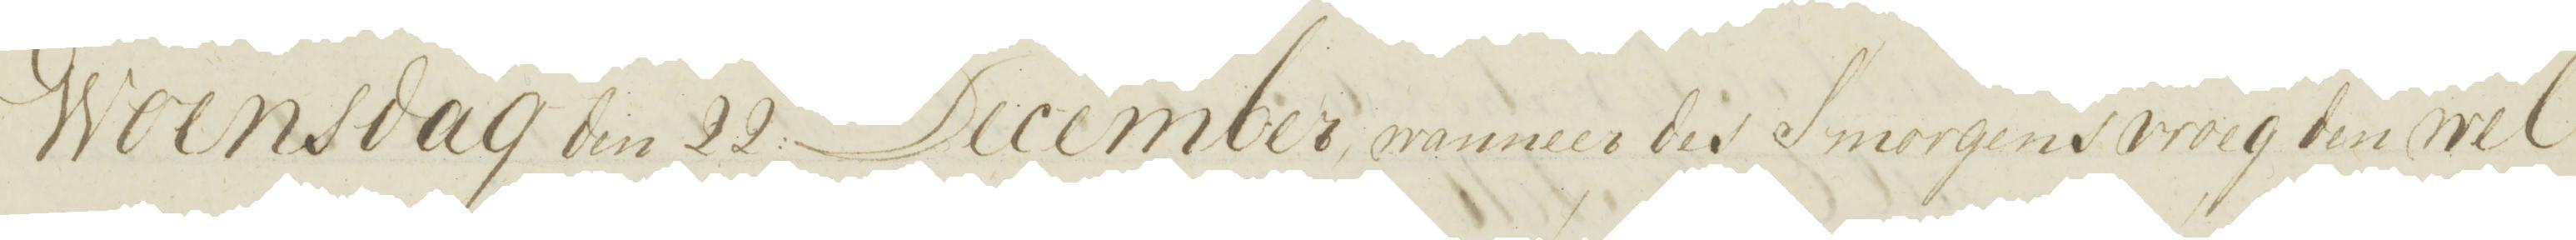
Woensdag den 22:' December, wanneer des s'morgens vroeg den wel
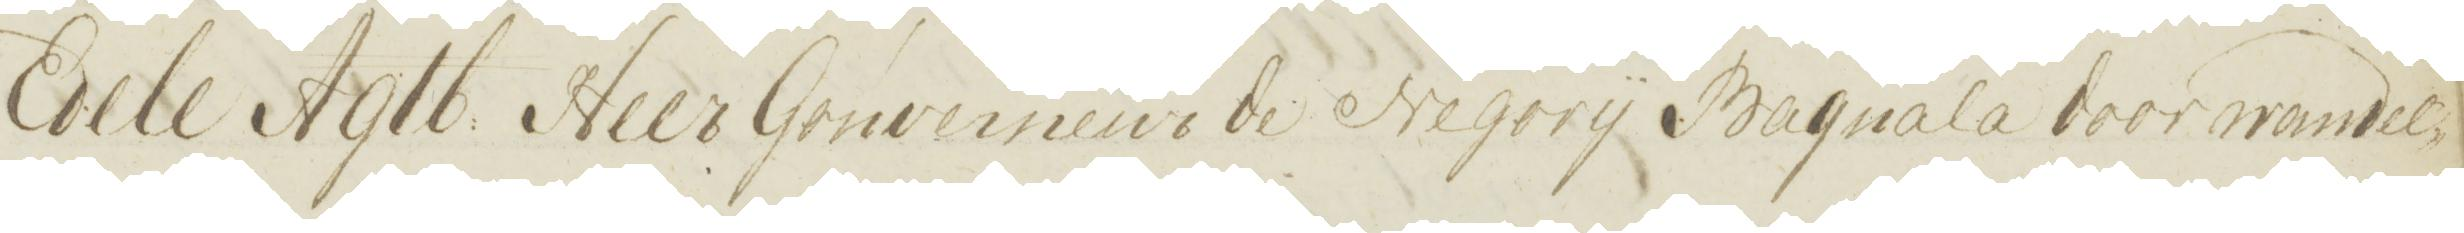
Edele Agtb: Heer Gouverneur de Negorij Baguala door wandel„
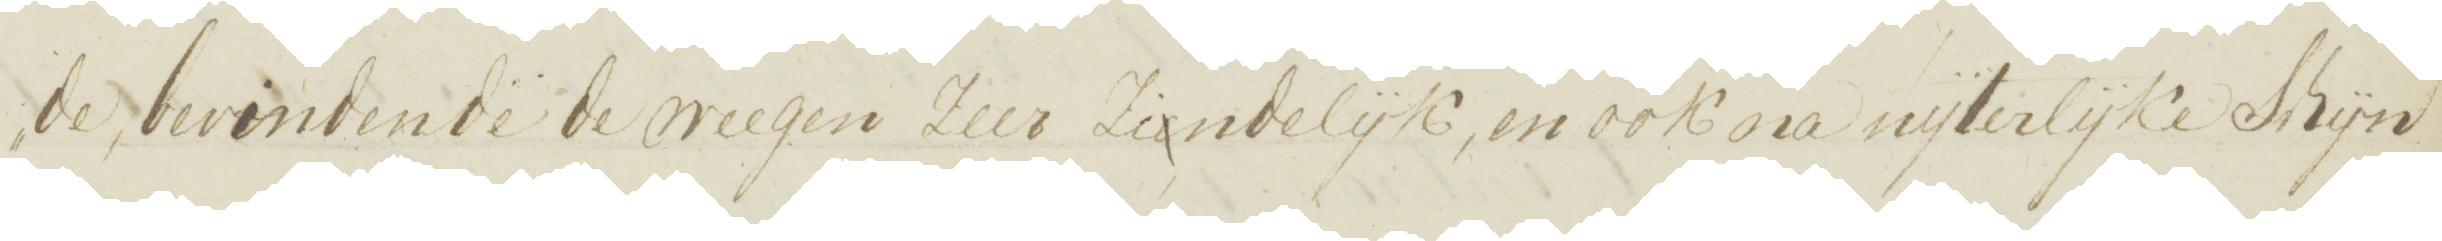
„de, bevindende de weegen zeer ziendelijk, en ook na uijterlijke schijn
